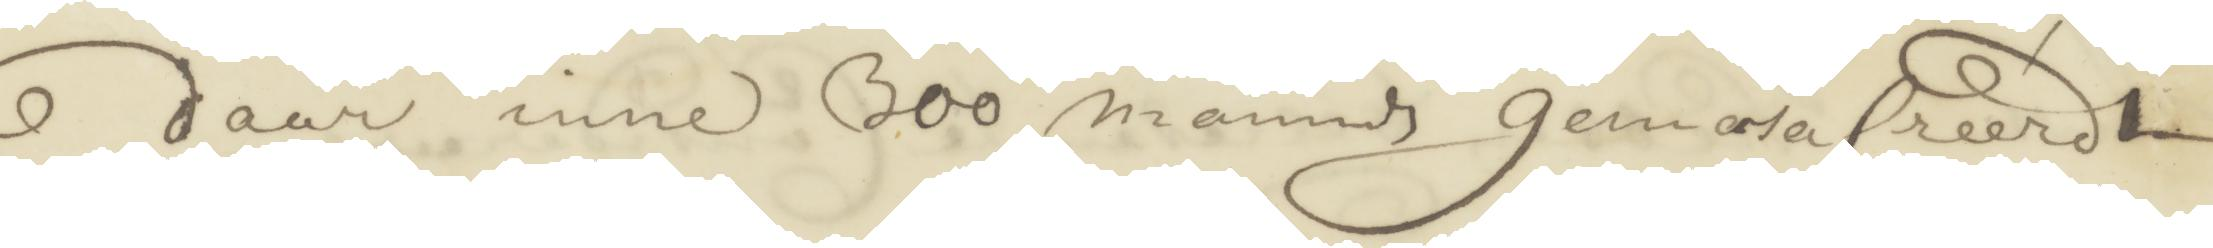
daar inne 300 mannen gemasacreerd te
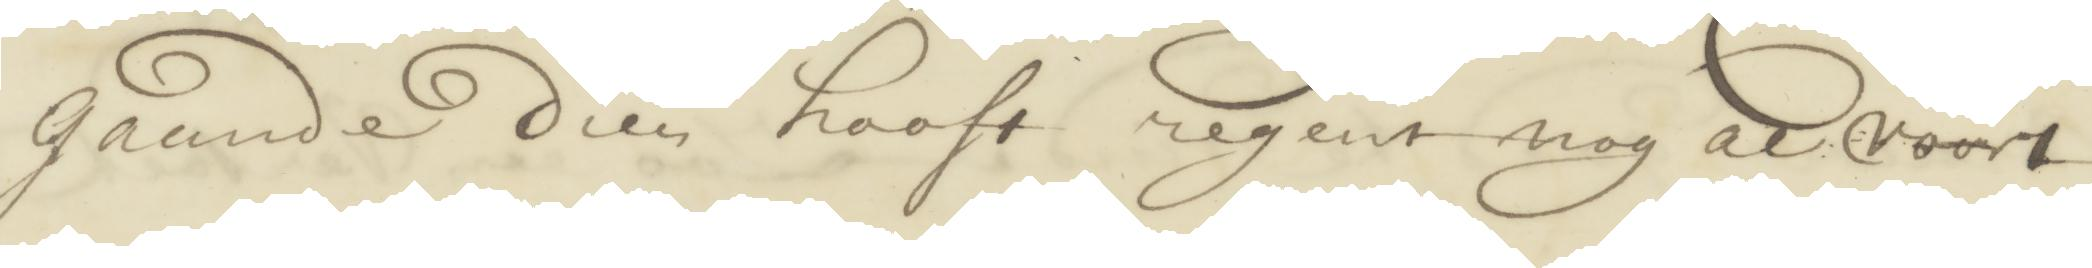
gaande dien hooft regent nog al voort
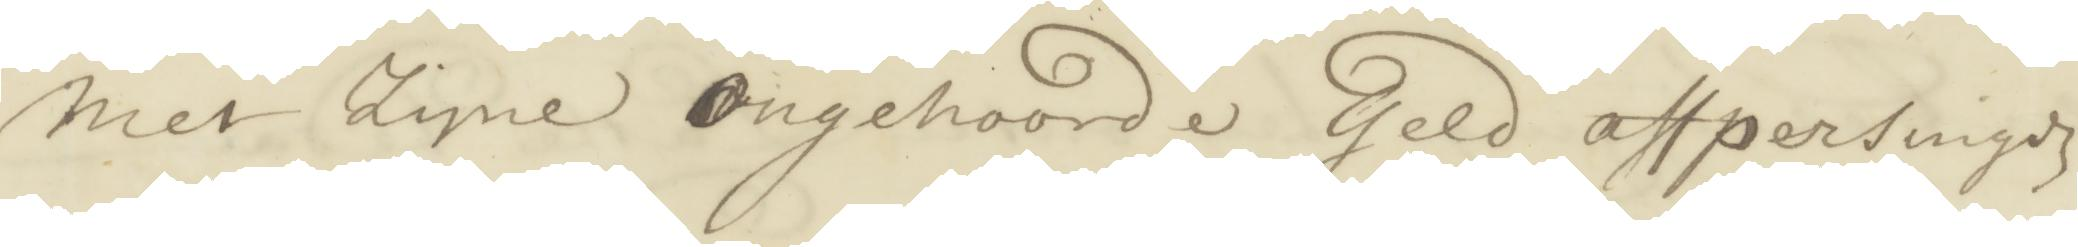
met zijne ongehoorde geld affpersingen
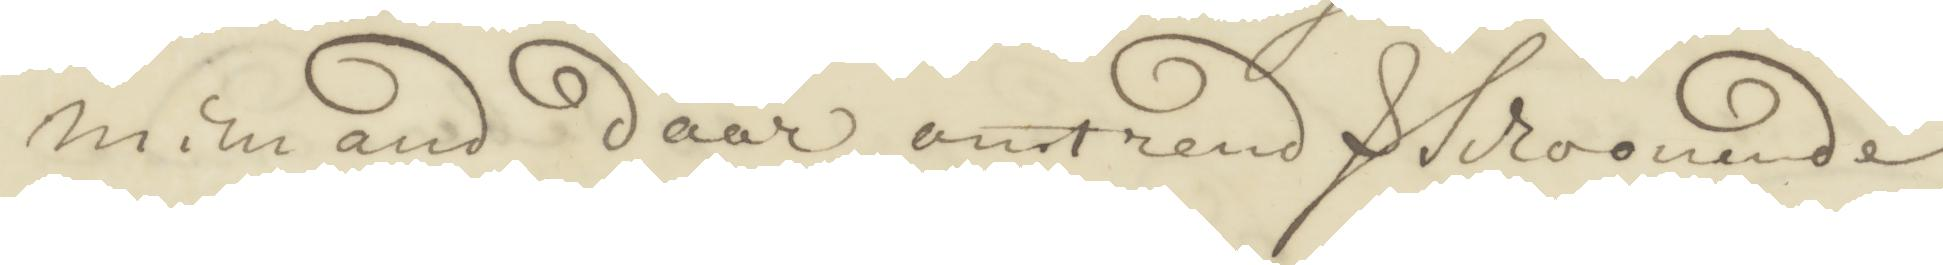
niemand daar omtrend verschoonende
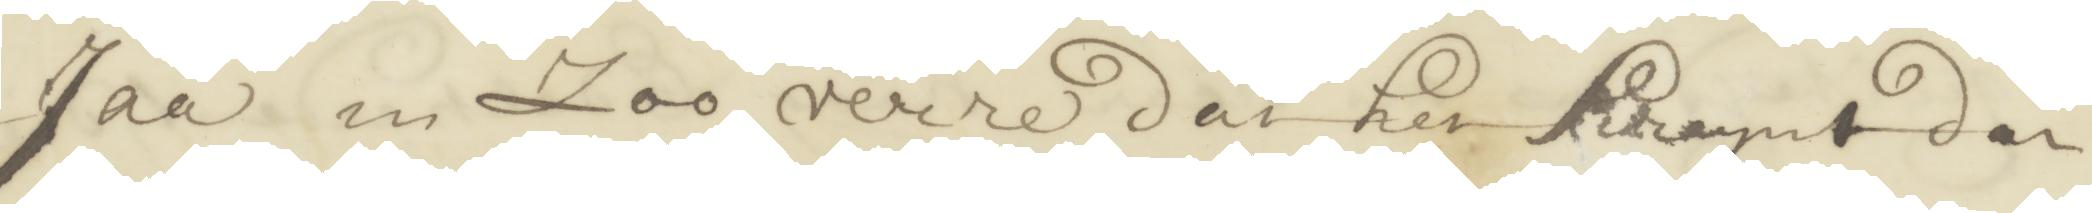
Jaa in zoo verre dat het scheynt dat
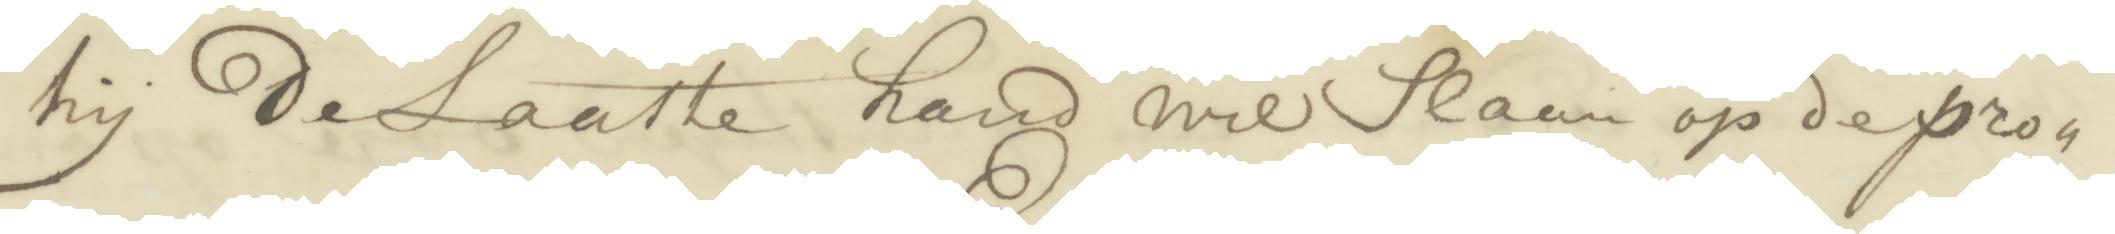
hij de laaste hand wil slaan op de pro„
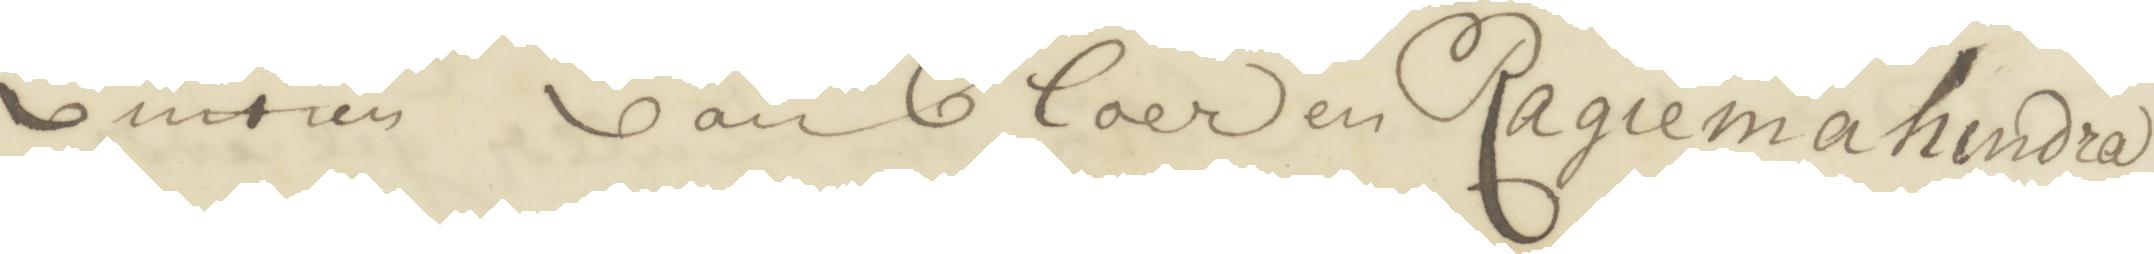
vintien van Eloer en Ragiemahendra
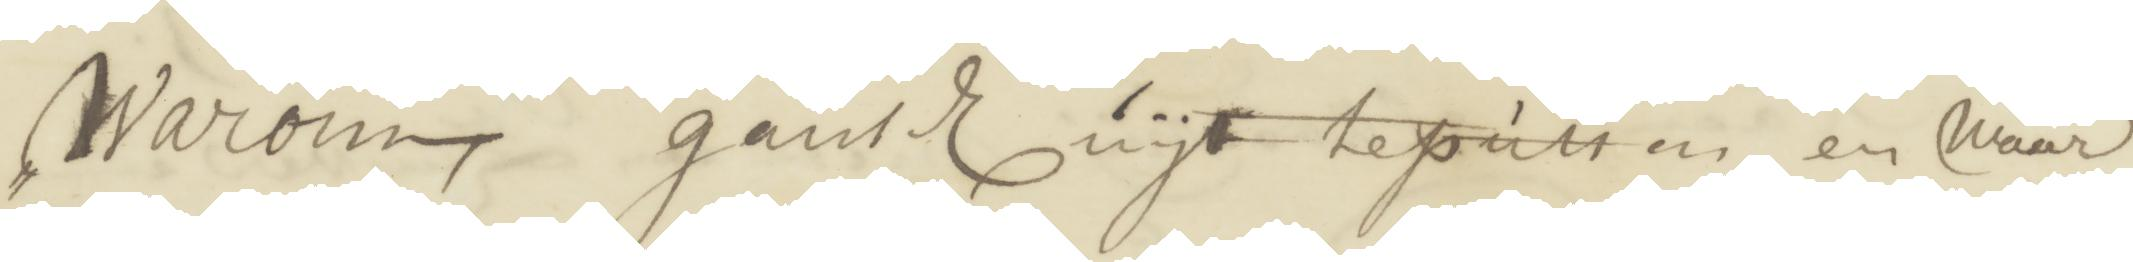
„warom, gansch uijt te putten en waar
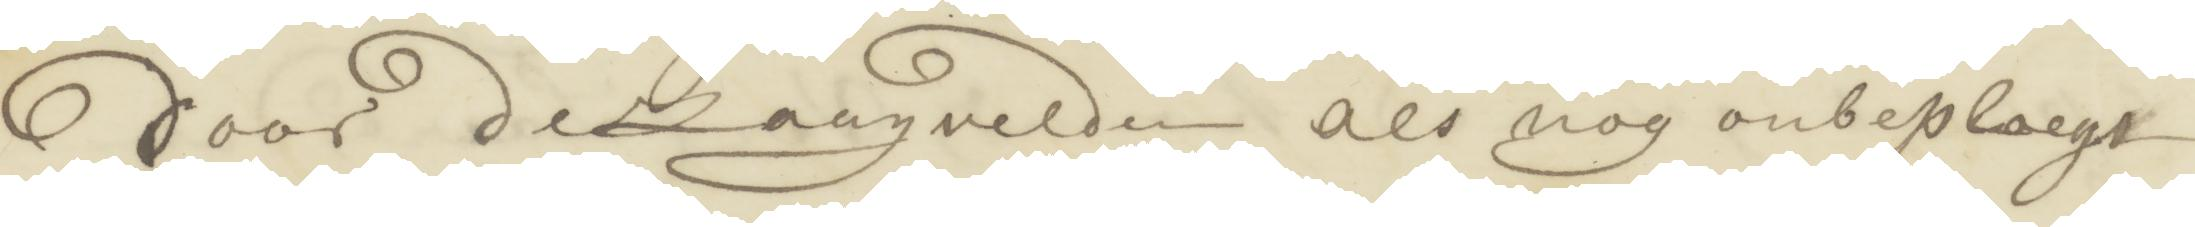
door de zaayvelden als nog onbeploegt
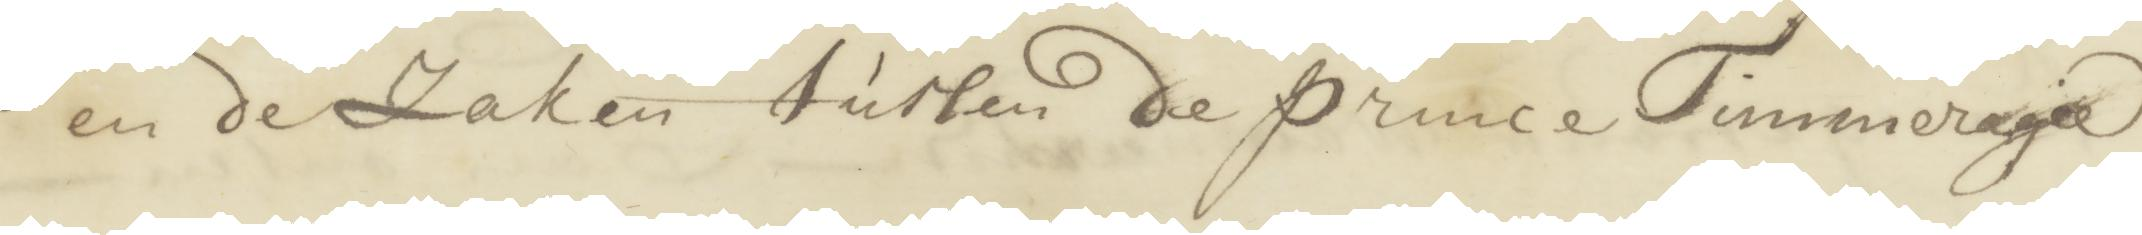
en de zaken tussen de prince Timmeragie
